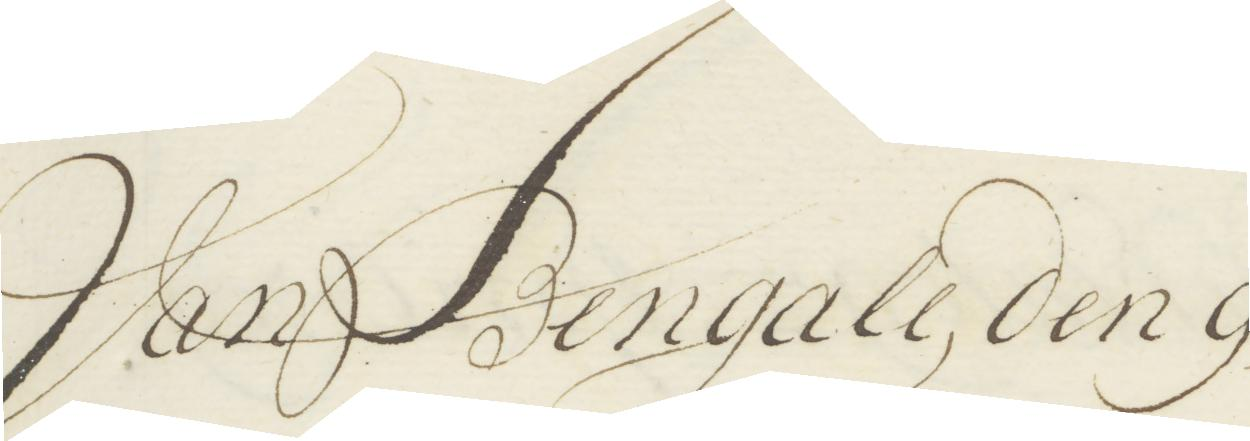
Van Bengale, den 9„en April 1709:
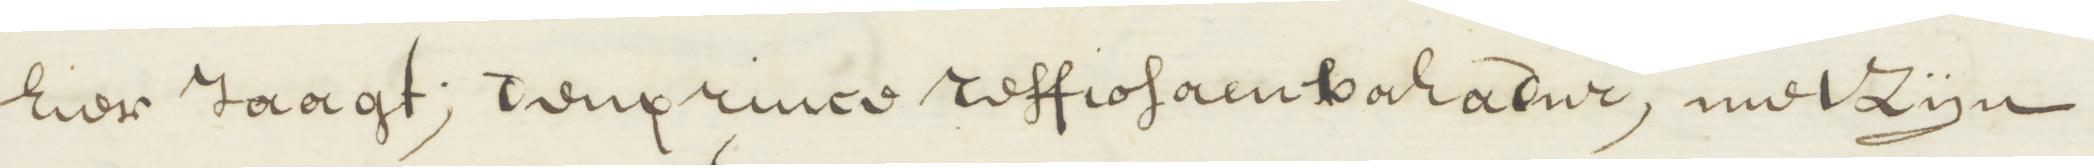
hier Iaagt; den prince reffiosaen bahadur, met zijn
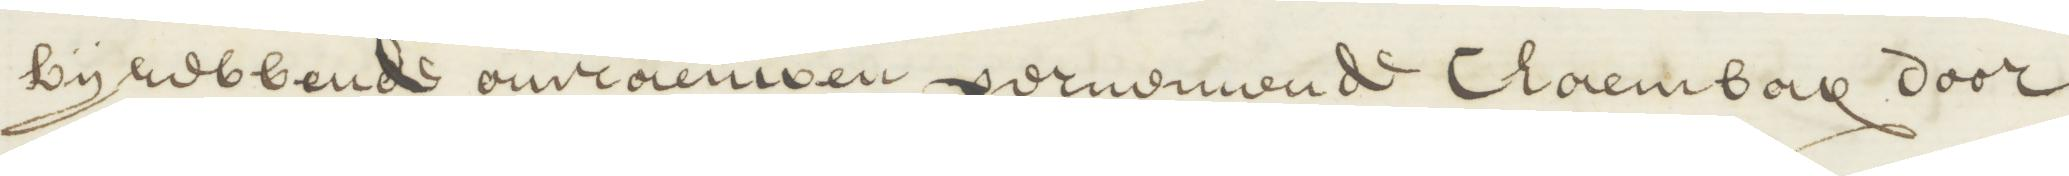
bij hebbende omraeuwen vernemende Chaembax door
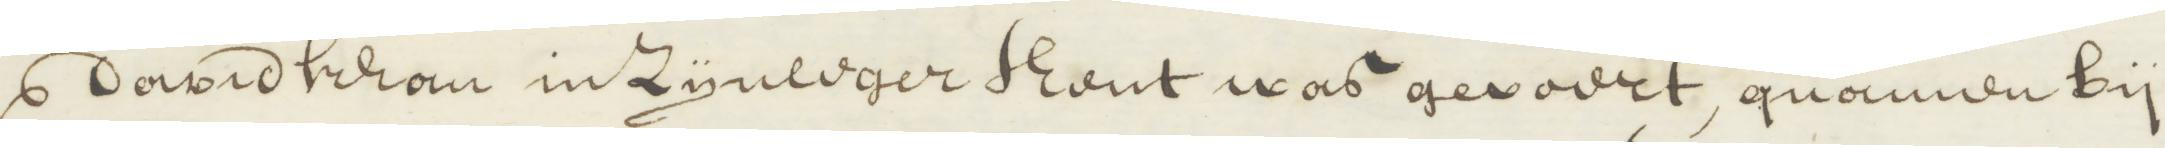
david heran in zijn leger thent was gevoert, quamen bij
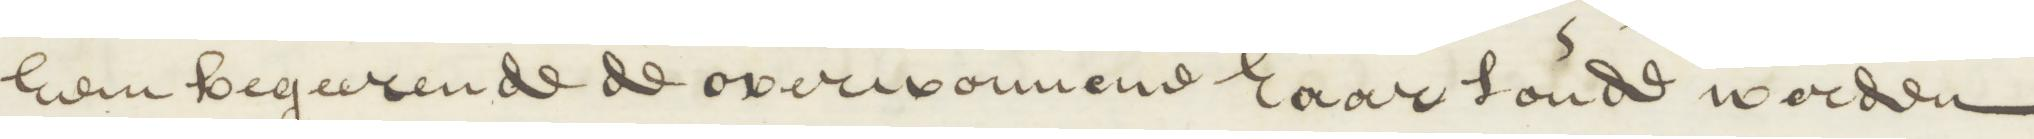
hem begeerende de overwonnene haar soude werden
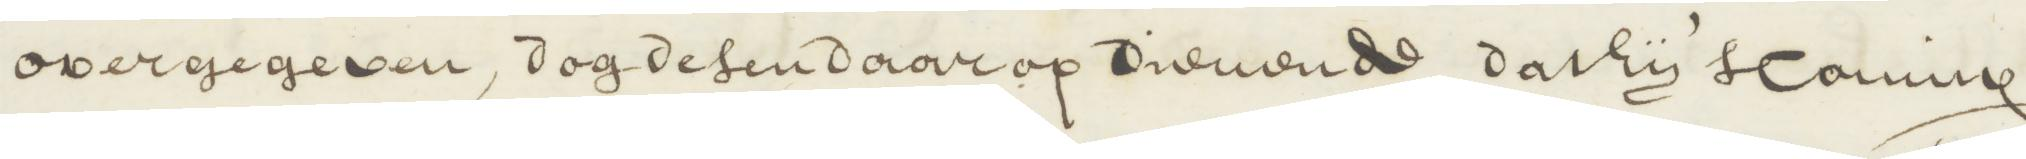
overgegeven, dog desen daarop dienende dat hij 's Coninx
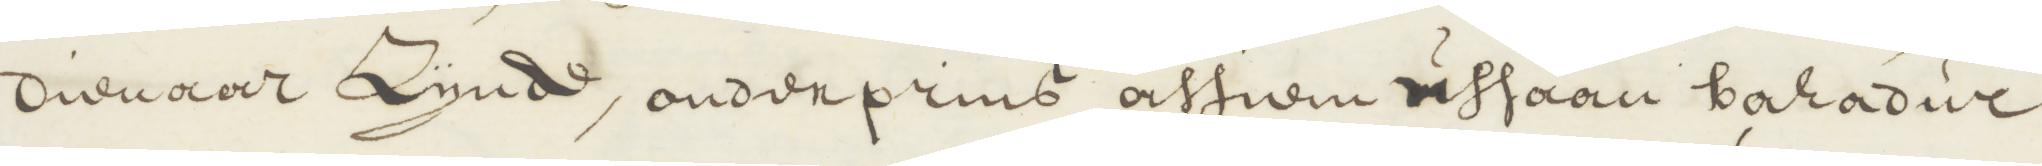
dienaar zijnde, onder prins assiem ussaan bahadur
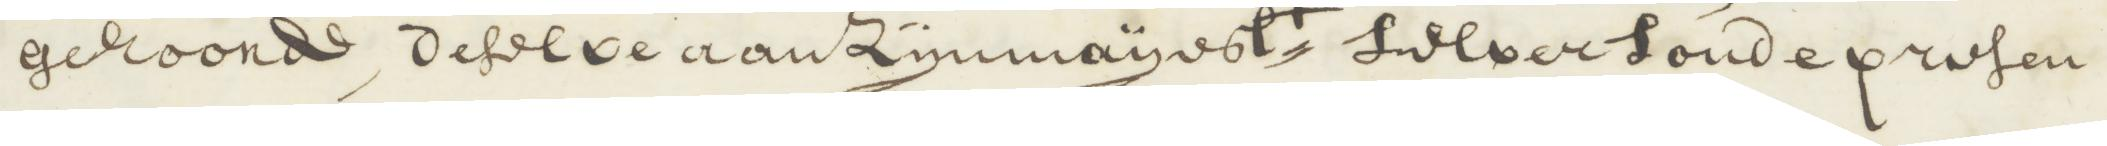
gehoorde, deselve aan zijn maijest„t selver soude presen
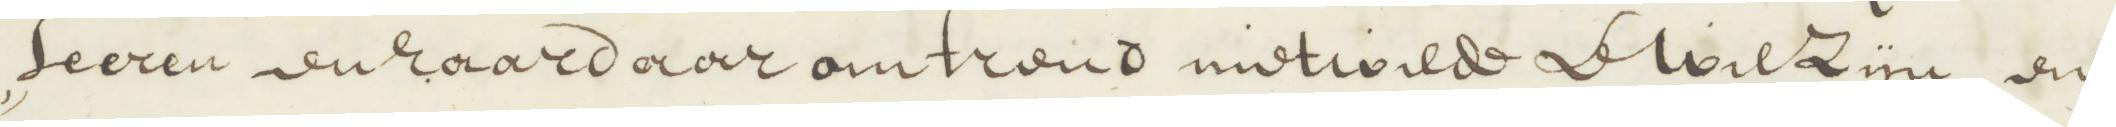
„teeren en haar daar omtrend niet wilde te wil zijn, en
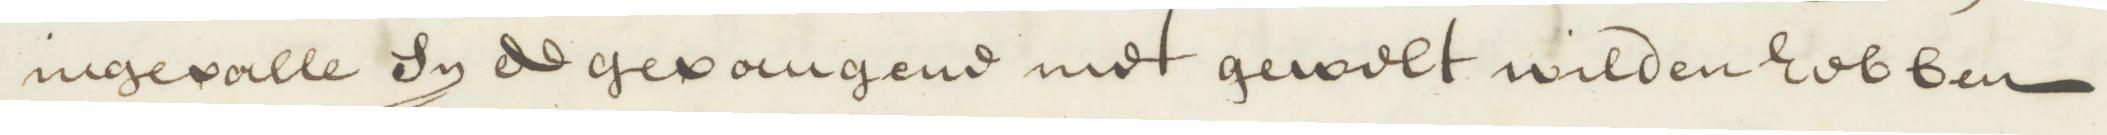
ingevalle sy de gevangene met gewelt wilden hebben
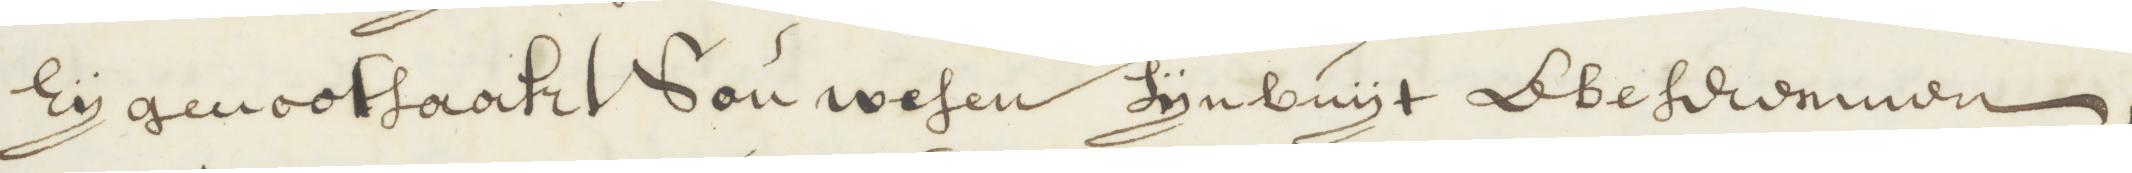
hij genootsaakt sou wesen sijn buijt te beschermen;
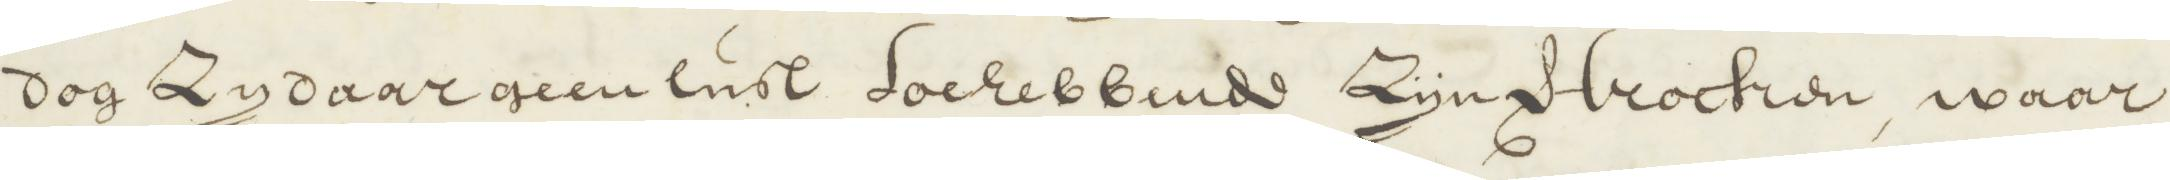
dog zy daar geen lust toehebbende zijn vertrocken, waar
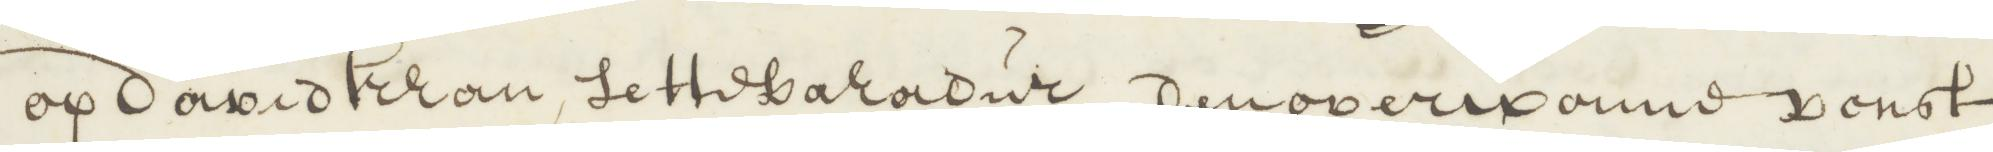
op david khan, settebahadur, den overwonne vorst
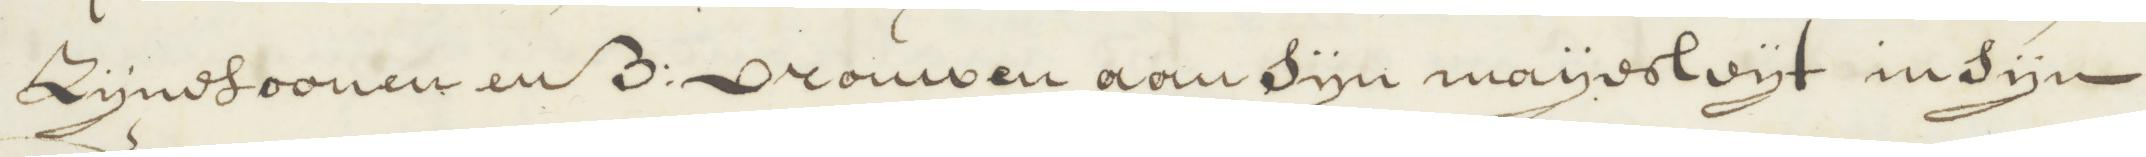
zijne soonen en 3: vrouwen aan sijn maijesteijt in sijn
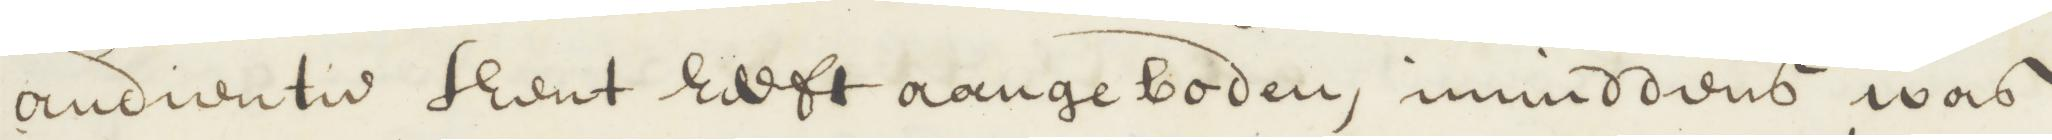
andientie thent heeft aangeboden, inmiddens was
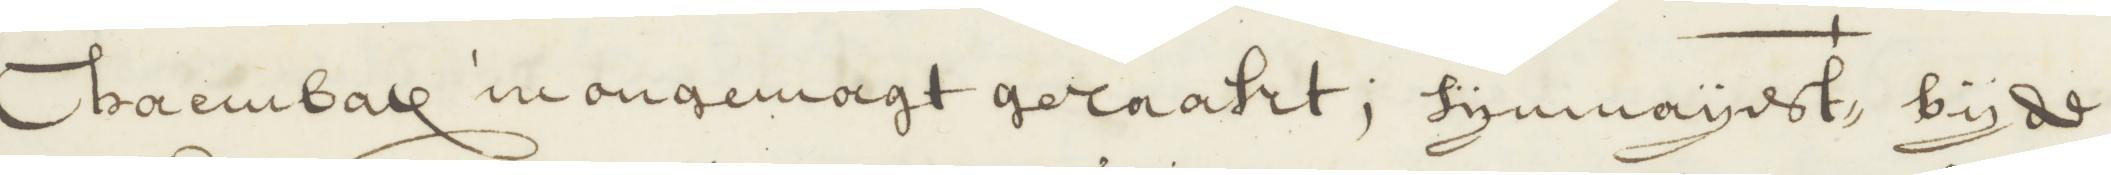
Chaembax in ongemagt geraakt; sijn maijest„t bij de
